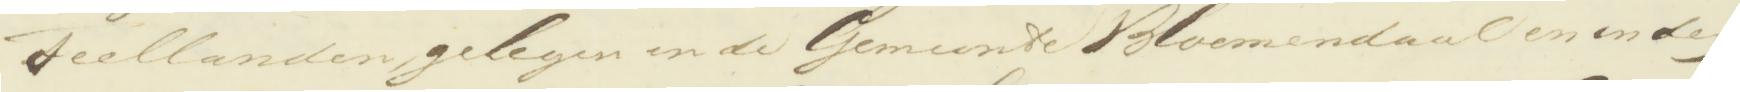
Teellanden, gelegen in de Gemeente Bloemendaal en in den
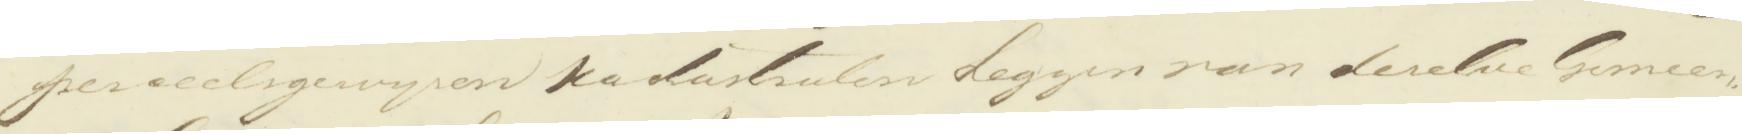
perceels gewyzen kadastralen Legger van dezelve Gemeen
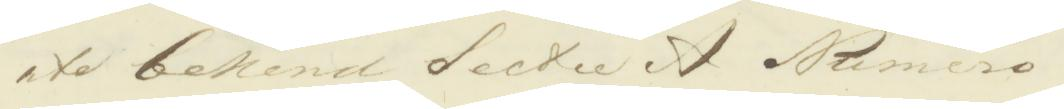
te bekend sectie A Numero
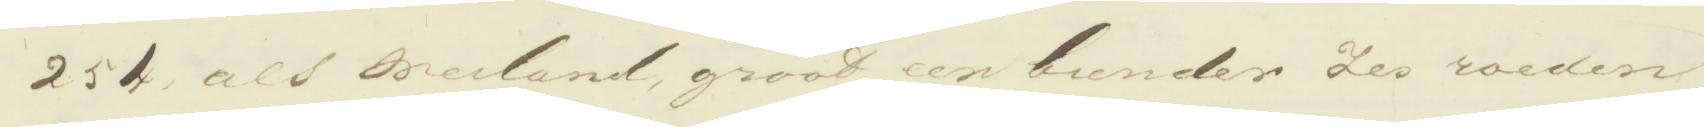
254, als weiland, groot een bunder zes roeden
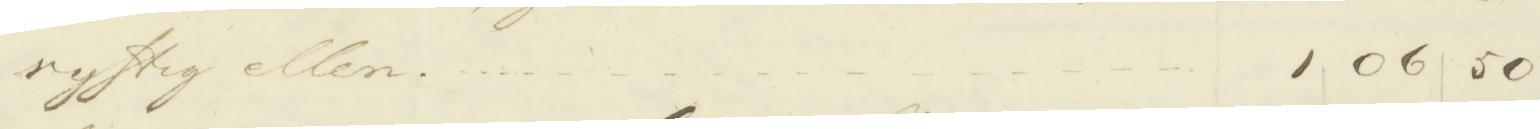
vyftig ellen - - - - - - - - - - - - - - - - - 1 06 50
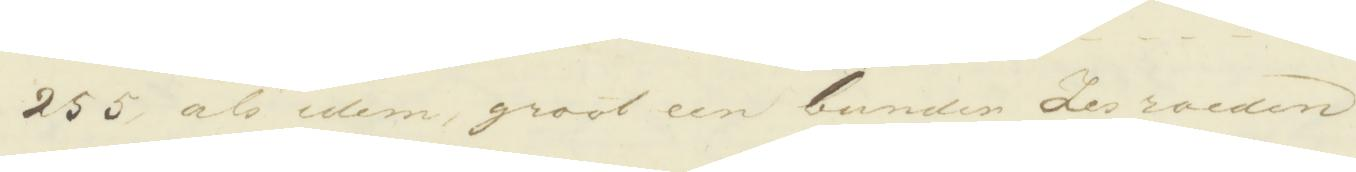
255, als idem, groot een bunder zes roeden
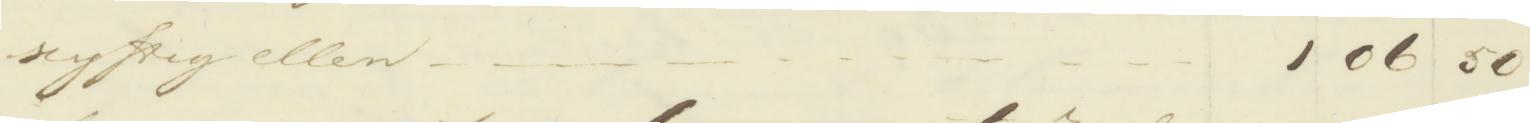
vyftig ellen - - - - - - - - - - - - - - 1 06 50
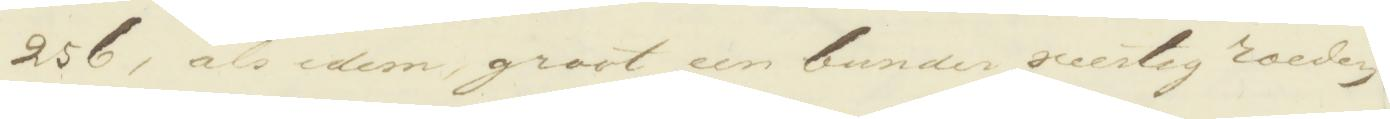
256, als idem, groot een bunder veertig roeden
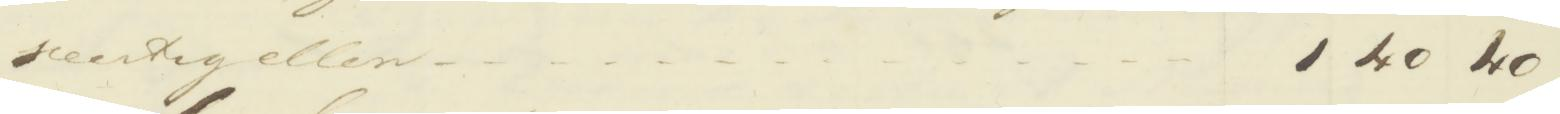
veertig ellen - - - - - - - - - - - - - - 1 40 40
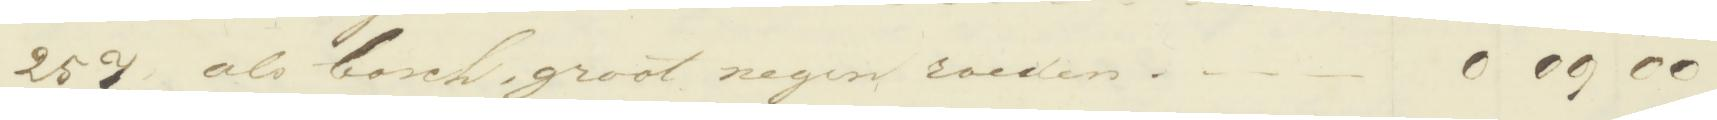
257, als bosch, groot negen roeden - - - - 0 09 00
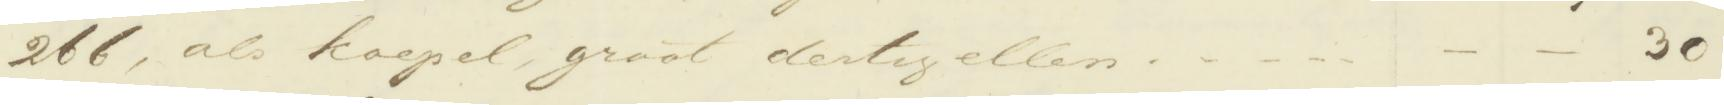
266, als koepel, groot dertig ellen - - - - - — — 30
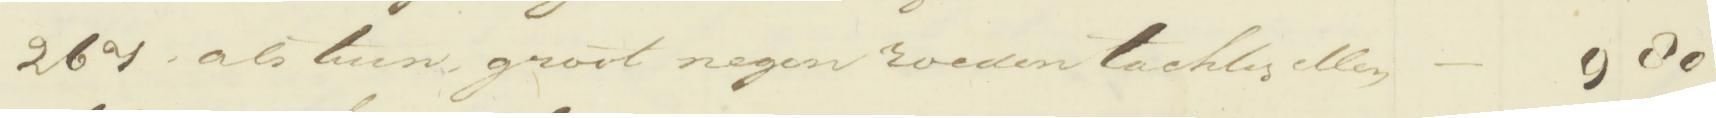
267, als tuin, groot negen roeden tachtig ellen — 9 80
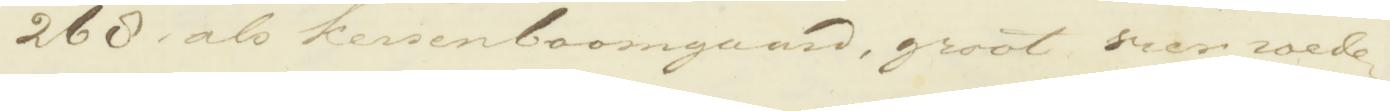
268, als kersenboomgaard, groot vier roeden
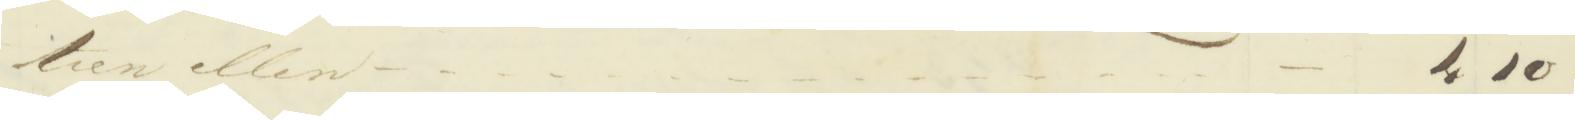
tien ellen - - - - - - - - - - - - - - - — 4 10
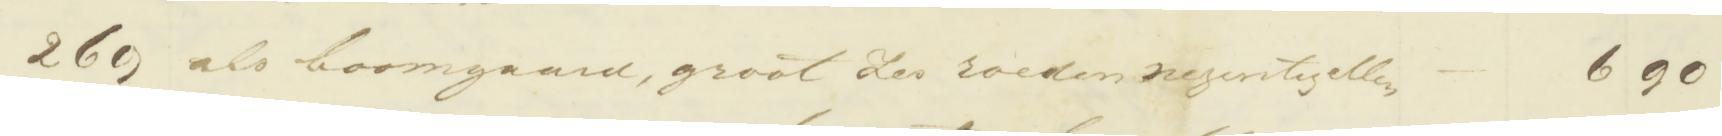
269 als boomgaard, groot zes roeden negentig ellen — 6 90
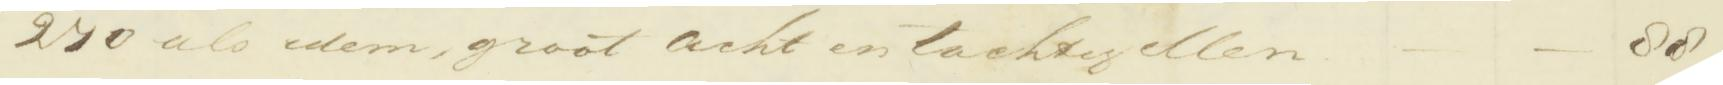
270 als idem, groot acht en tachtig ellen — — 88
